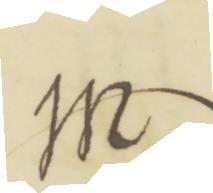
112
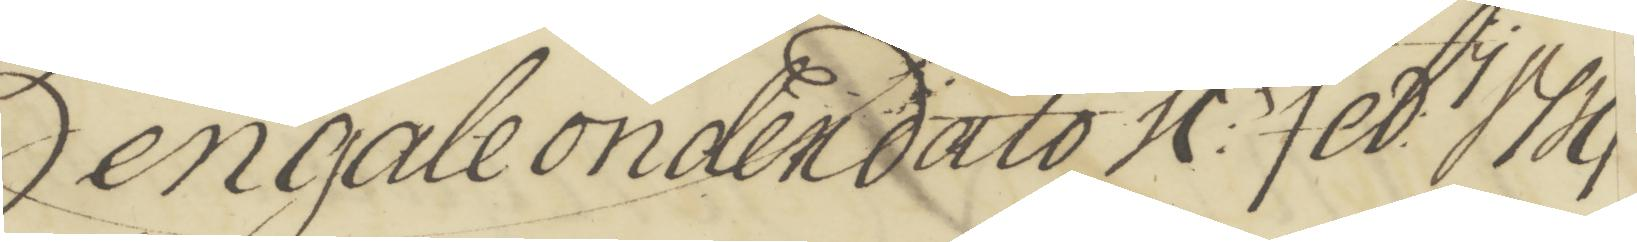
Van Bengale onder dato 15:en feb:ij 1714
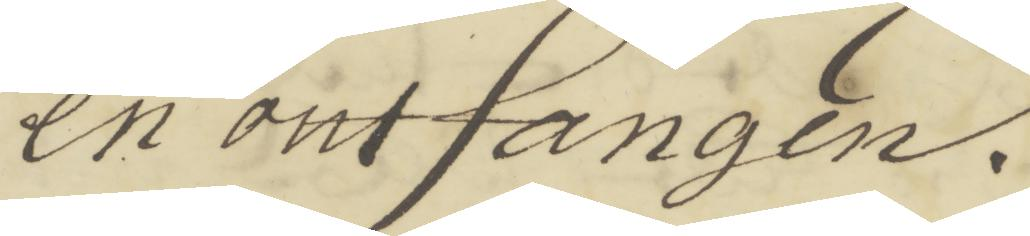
en ontfangen.
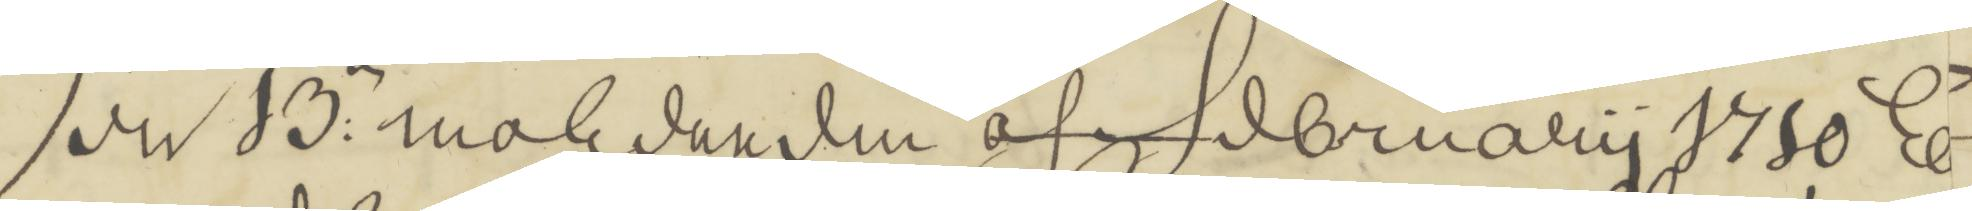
Den 13:en moherrem of februarij 1710 he
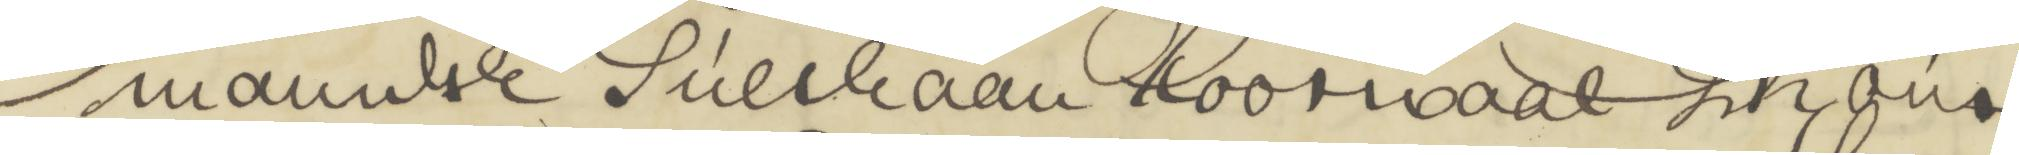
mameth sulthaan kootwaal schout
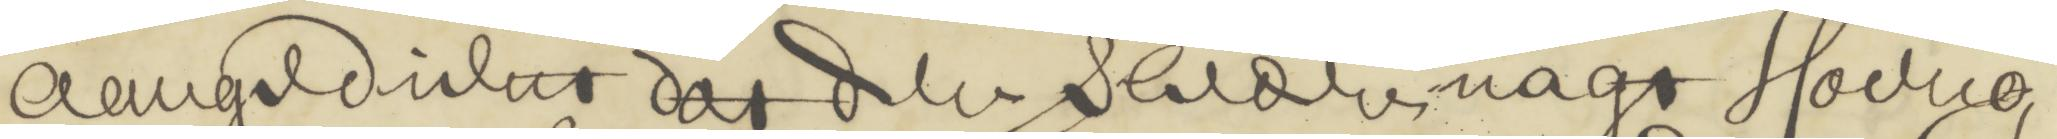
aangedient dat den verleden, nagt tsoeno,
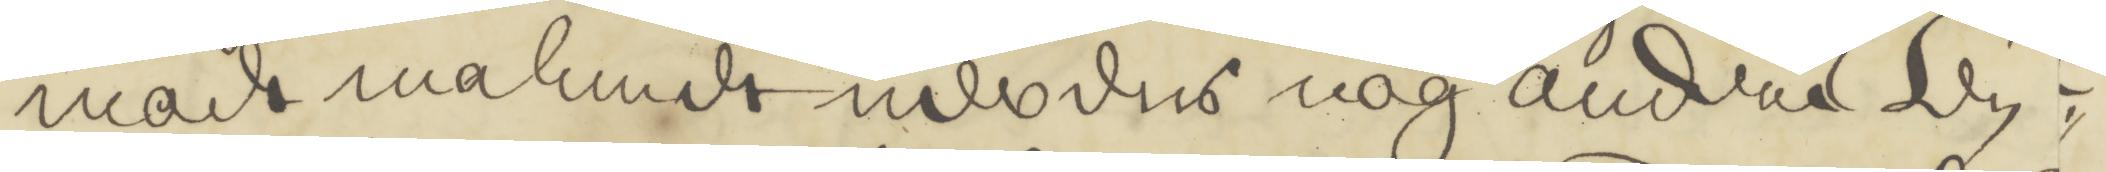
maet mahmet nevens nog andere ten
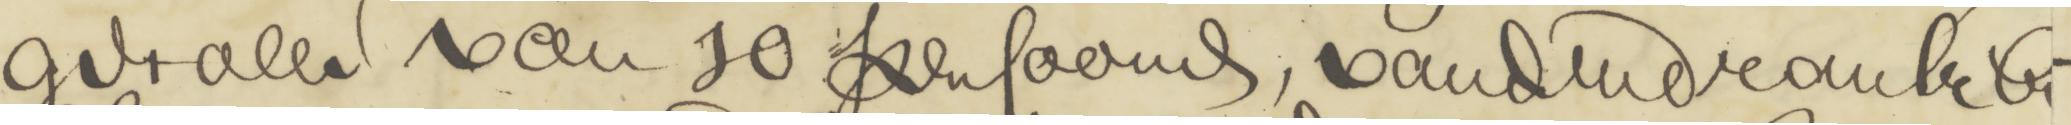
getalle van 10 persoonen; van den drankb
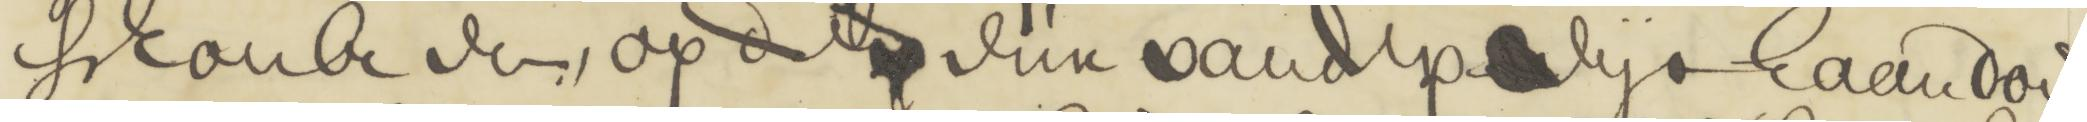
schonken, op de deur van de peijt haan do
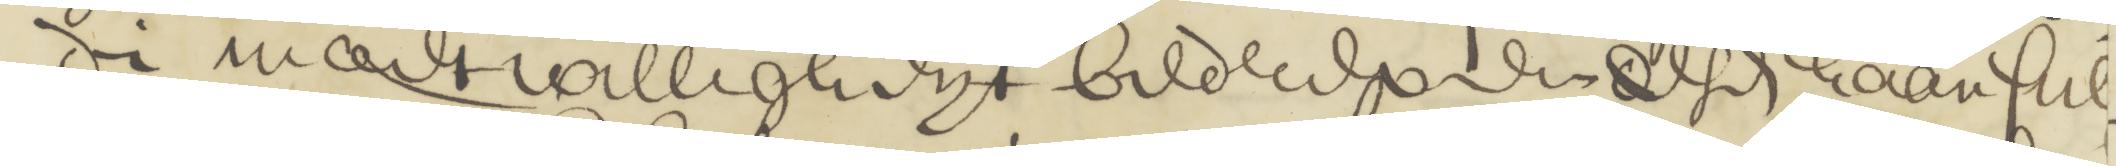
di moetwilligheyt beneven desen haar sul
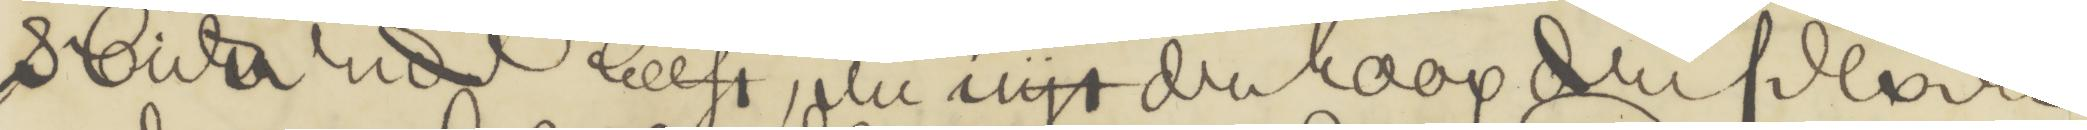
verbiedende heeft, en uijt den hoop den selven
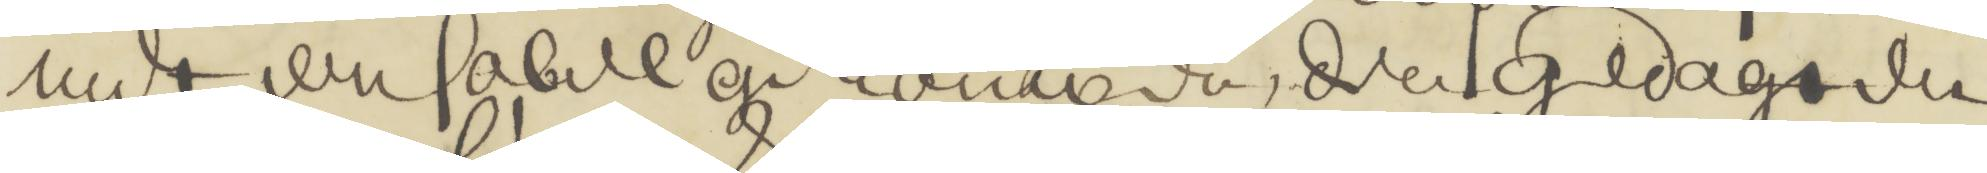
met een sabel gehouwen, den gedagten
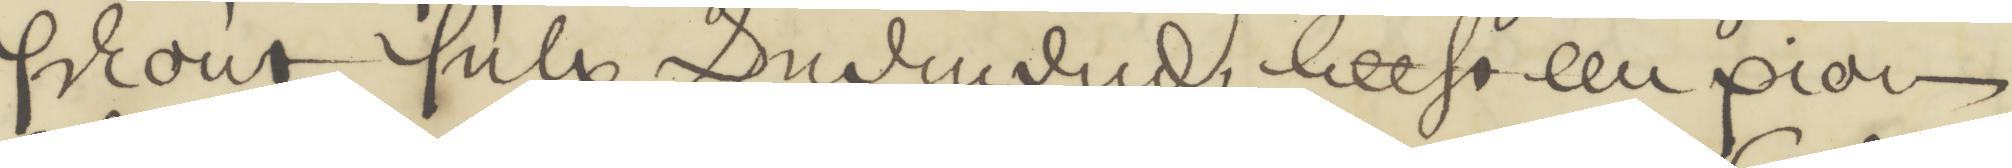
schout sulx vernemend, heeft een pion
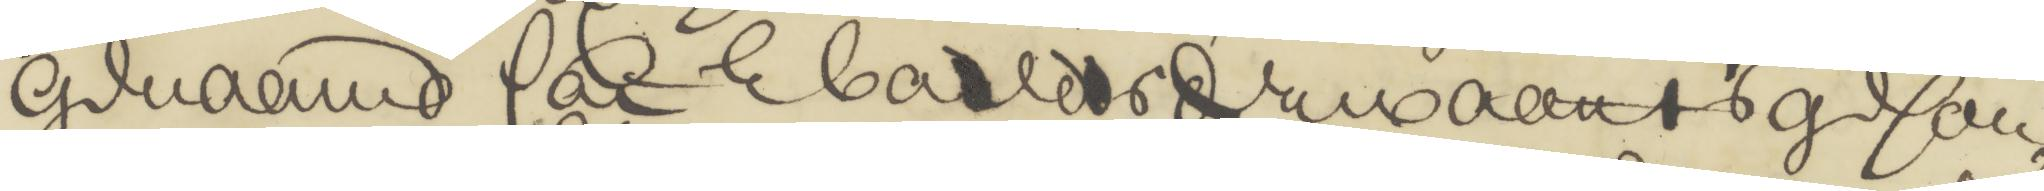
genaamd sachbaeds derwaarts geson„
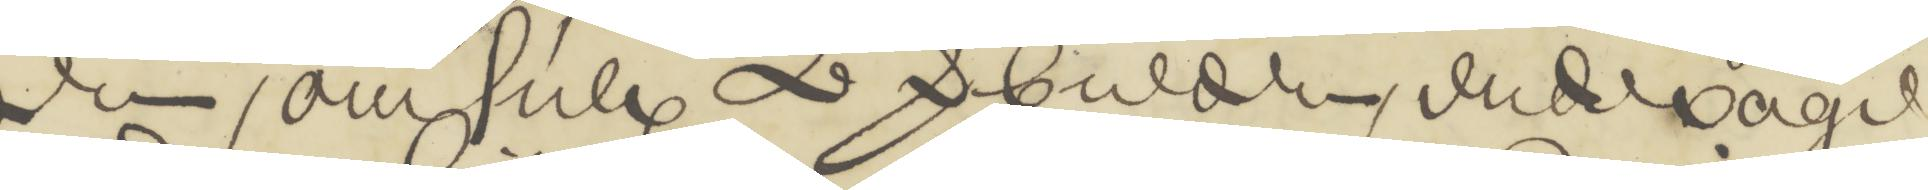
den, om sulx te verbieden, en de vage
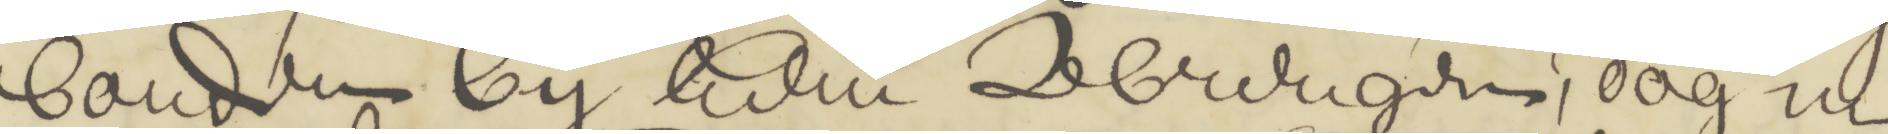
bonden bij hem tebrengen, dog in
